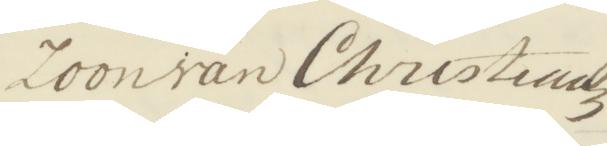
Zoon van Christiaan
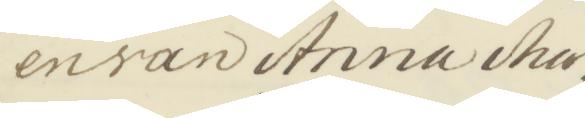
en van Anna Ma
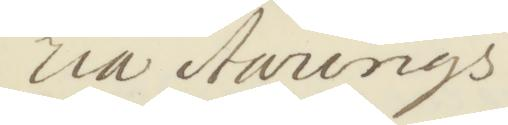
ria Aarings
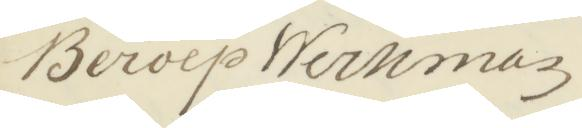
Beroep Werkman
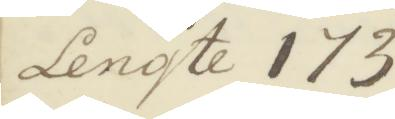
Lengte 173
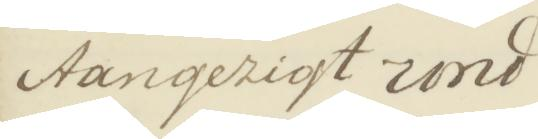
Aangezigt rond
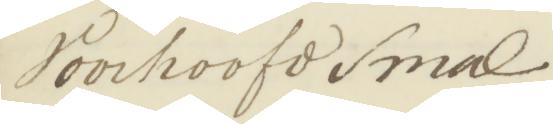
Voorhoofd Smal
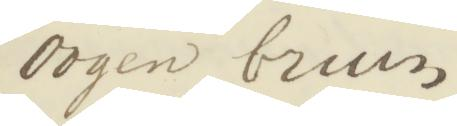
Oogen bruin
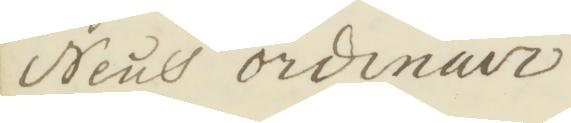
Neus ordinair
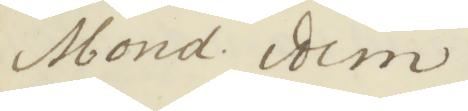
Mond. idem
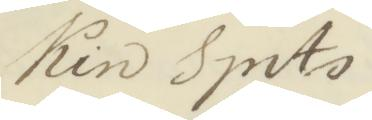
Kin spits
